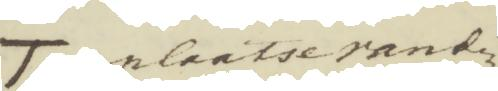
¶ inplaatse van den
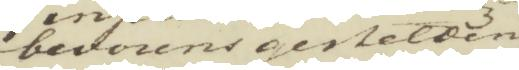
bevorens gestelden
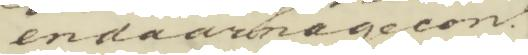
en daarna gecon.
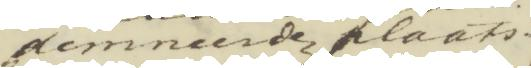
demneerden plaats
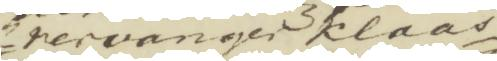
vervanger klaas,
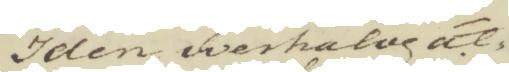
Iden weshalve al
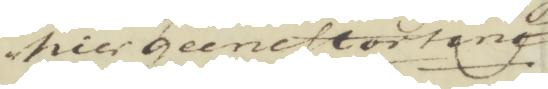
„hier geene storting
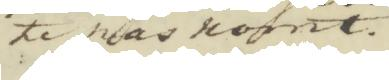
te pas komt.
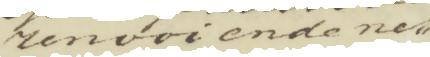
renvoi ende ne
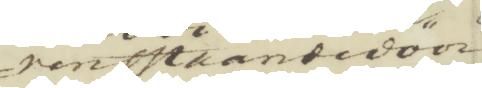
venstaande door
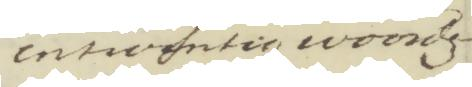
entwintig woorden
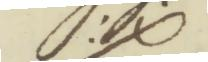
J:K
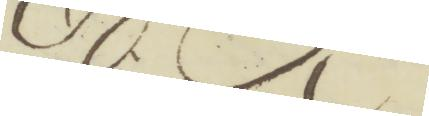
A. K
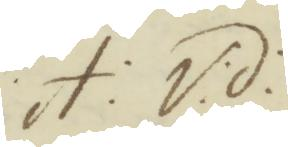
A: v:d:
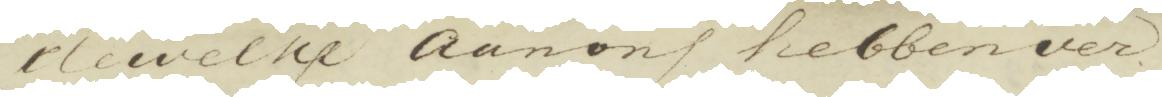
dewelke aan ons hebben ver„
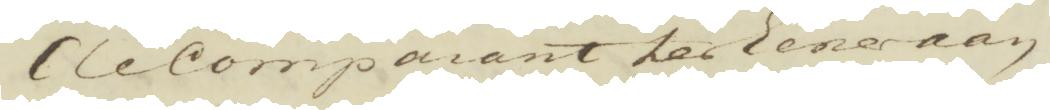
de comparant te Eener aan
